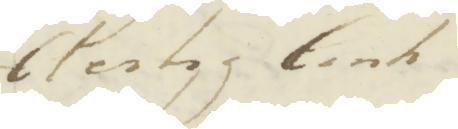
dertig Cent
